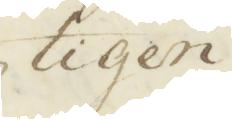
tigen
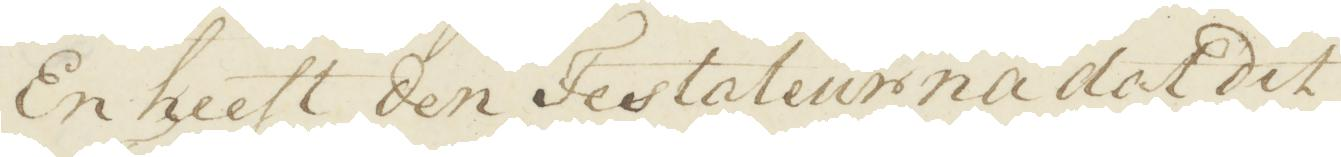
En heeft den Testateur na dat dit
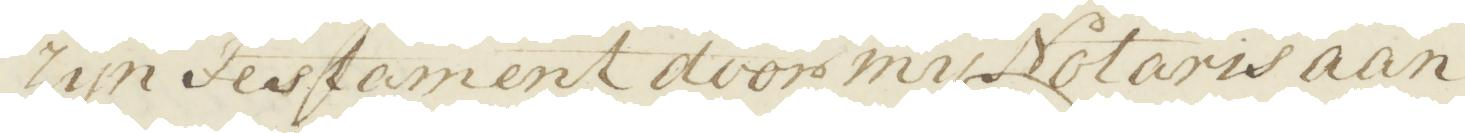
zyn Testament door my Notaris aan
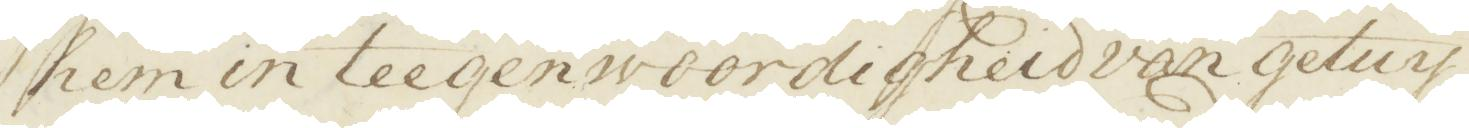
hem in teegenwoordigheid van getuy
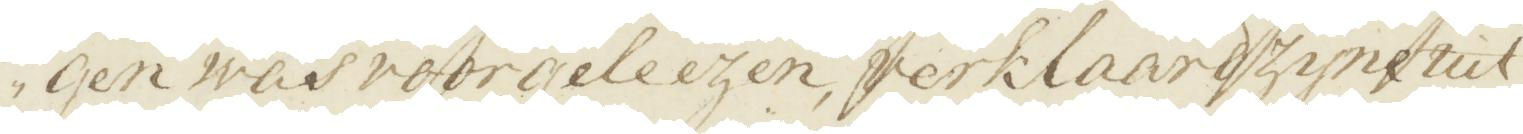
„gen was voorgeleezen, verklaard zyne uit
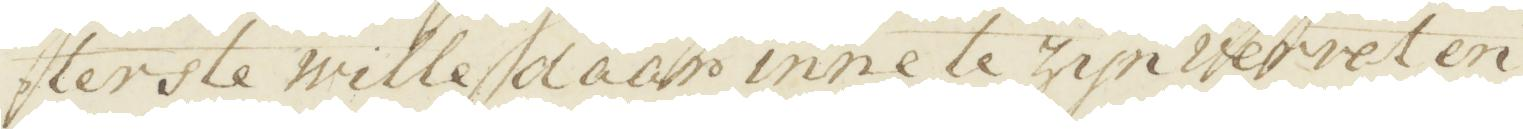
„terste wille daar inne te zyn vervet en
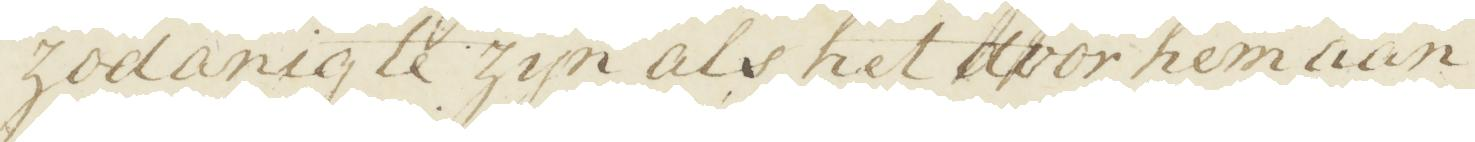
zodanig te zyn als het door hem aan
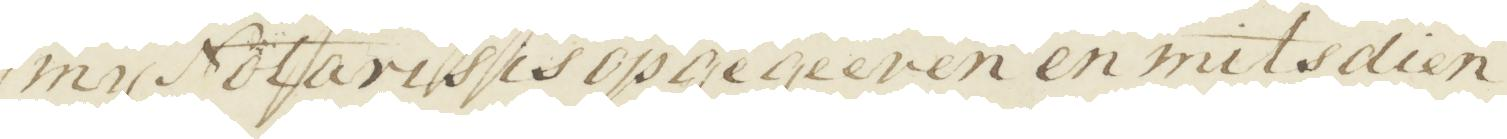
my Notaris is opgegeeven en mitsdien
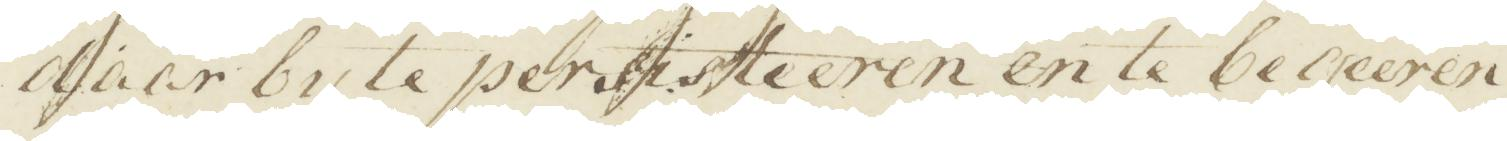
daar by te persisteeren en te begeeren
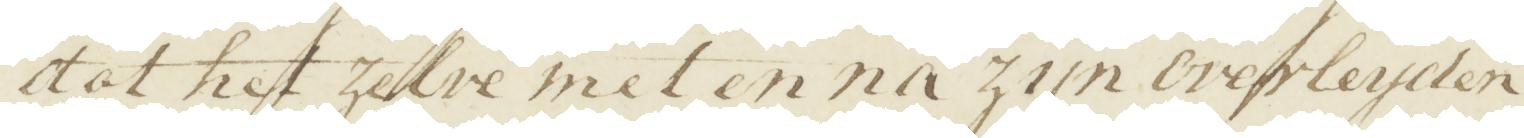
dat het zelve met en na zyn overleyden
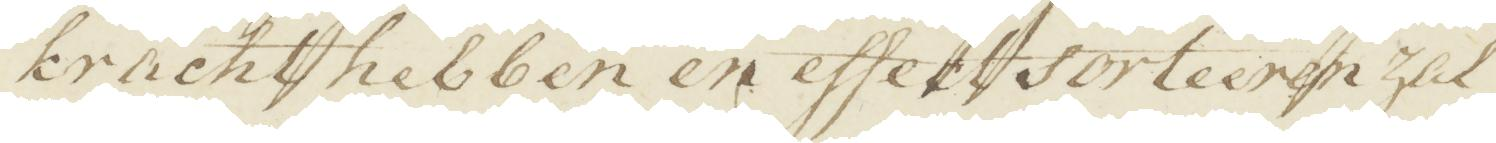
kracht hebben en effect sorteeren zal
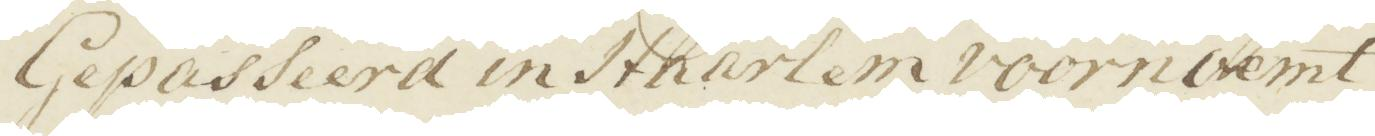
Gepasseerd in Haarlem voornoemt
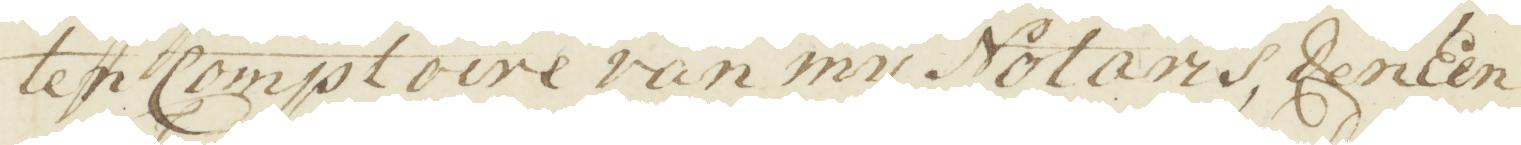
ten Comptoire van my Notaris, den Een
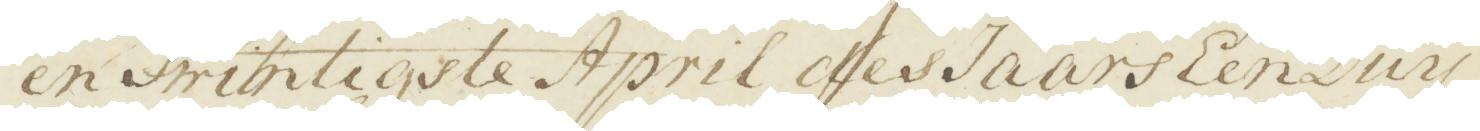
en Twintigste April des Iaars Een Duy
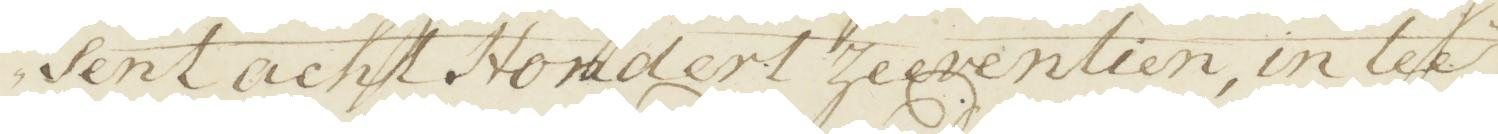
„sent acht Hondert zeeventien, in tee
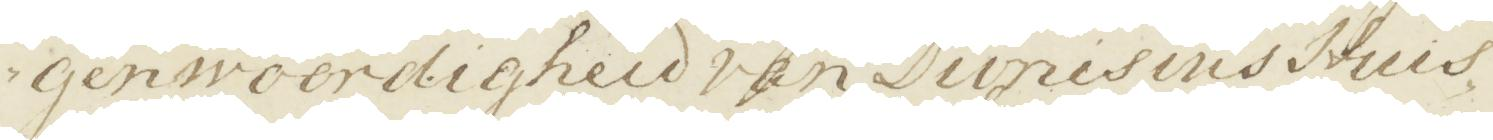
„genwoordigheid van Dionisius Huis„
